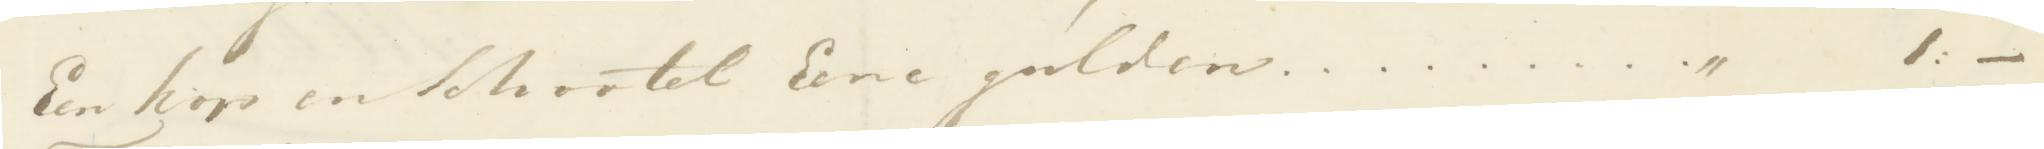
Een kop en schootel Eene gulden . . . . . . . . .. . . . . . „ 1:—
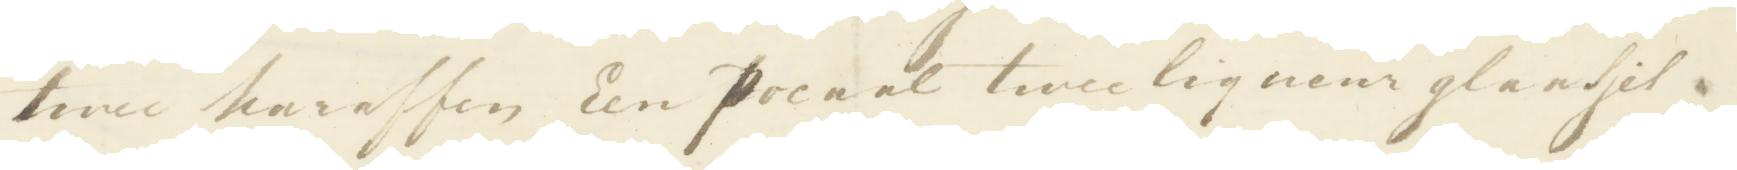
Twee karaffen Een pocaal twee twee liqueur glaasjes„
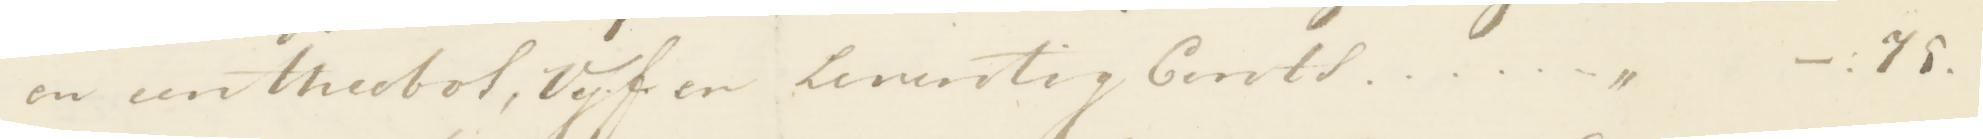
en een theebos, vyf en zeventig Cents. . . . . . . . . . . „ —:78.
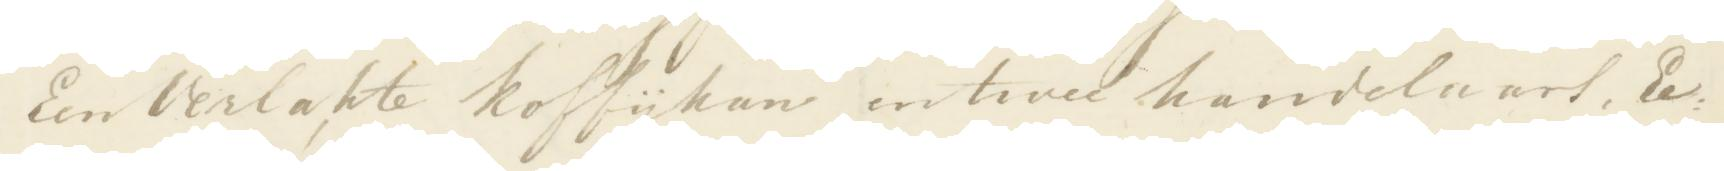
Een verlakte koffijkan en twee kandelaars. Ee:
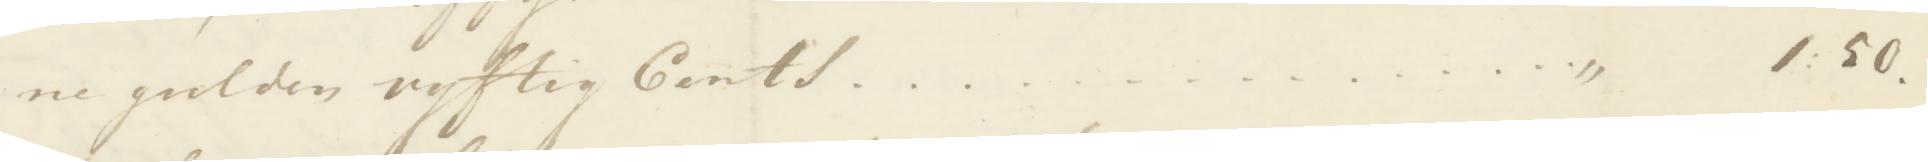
ne gulden vyftig Cents. . . . . . . . . . . . . . . . . . . . . . . . . „ 1:50.
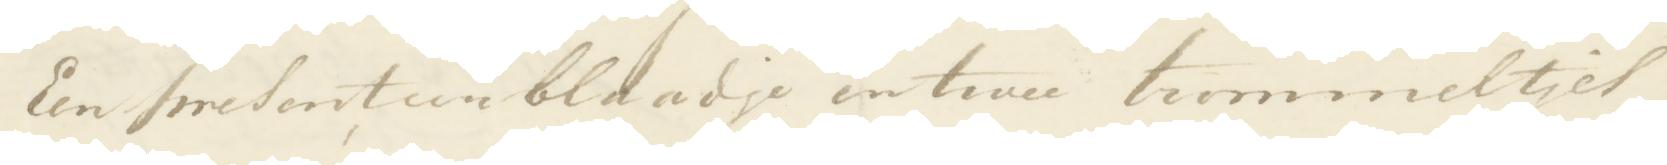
Een presenteer blaadje en twee trommeltjes
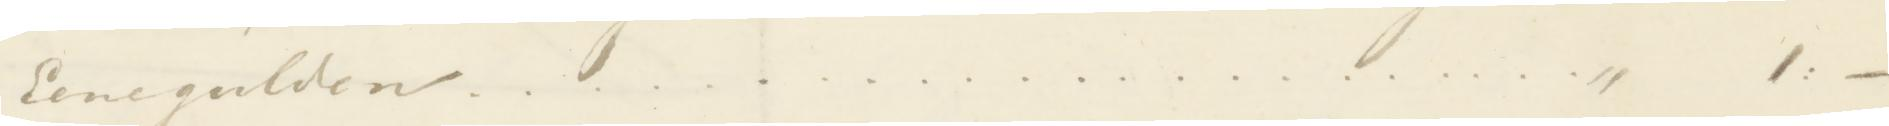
Eene gulden. . . . . . . . . . . . . . . . . . . .. . . . . . . . . . . . . . „ 1:—
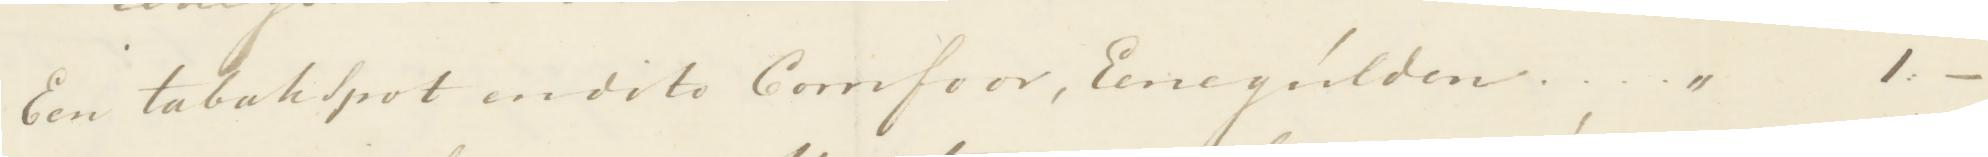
Een tabakspot en dito Comfoor, Eene gulden „ 1:—
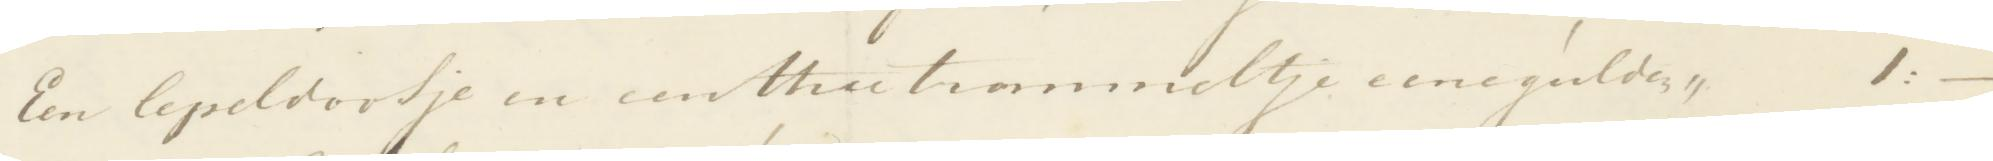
Een lepeldoosje en een thee trommeltje eene gulden „ 1:—
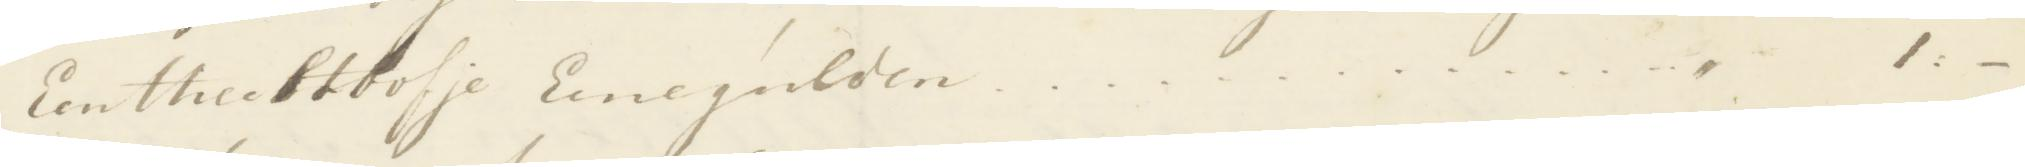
Een theestoofje Eene gulden . . . . . . . . . . . . . . .. . . . „ 1:—
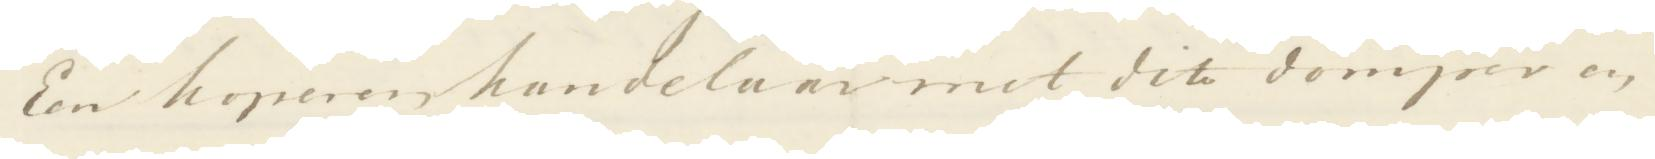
Een koperen kandelaar met dit domper en
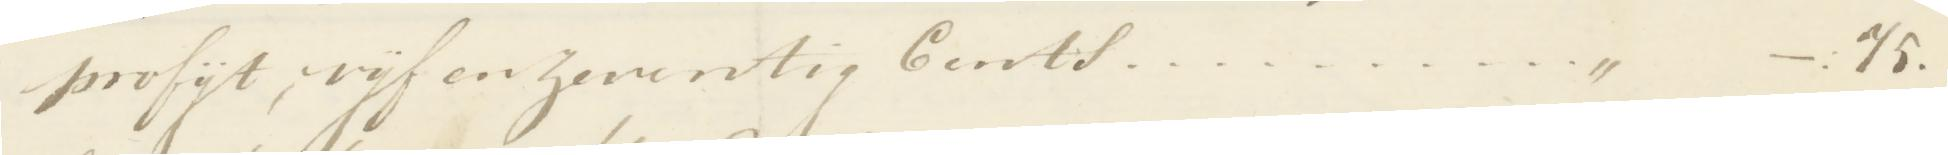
profijt, vijf en zeventig Cents . . . . . . . . . . .. . . . . . . . .„ —:75.
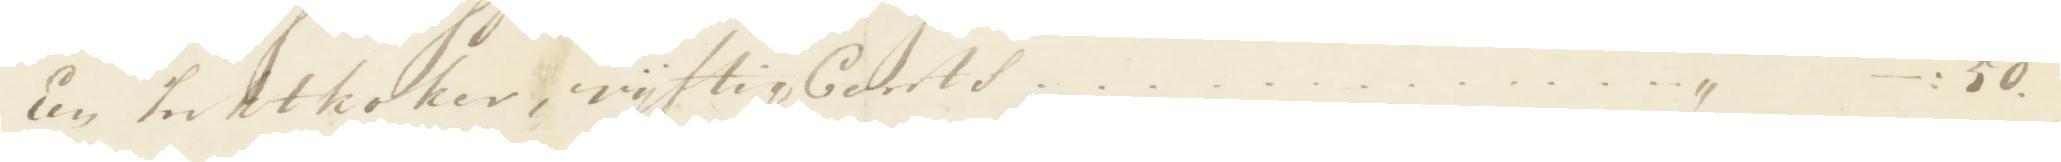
Een Inktkoker, vijftig Cents . . . . . . . . . . . . . . . . . . . . . „ —:50.
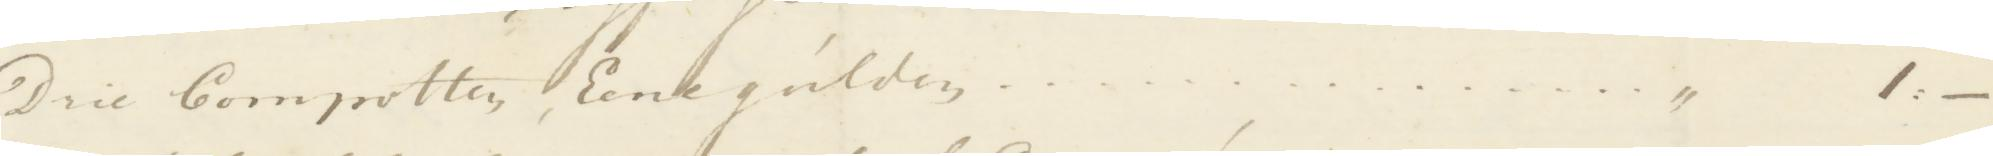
Drie Compotten, Eene gulden . . . . . . . . . . . . . . . . . . „ 1:—
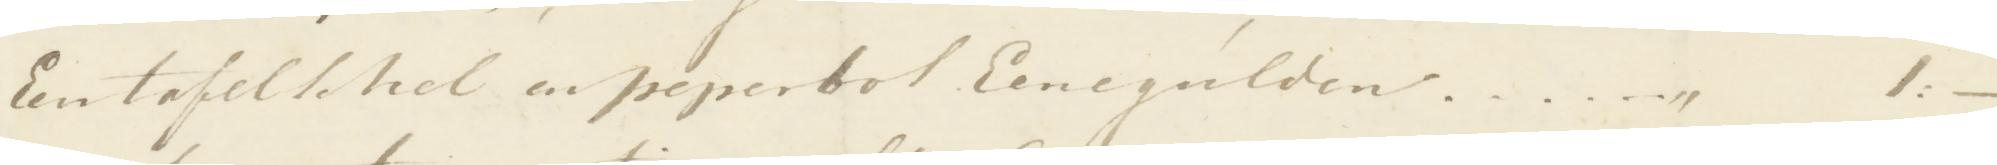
Een tafelschel en peperbos Eene gulden . . . . . . . . . . „ 1:—
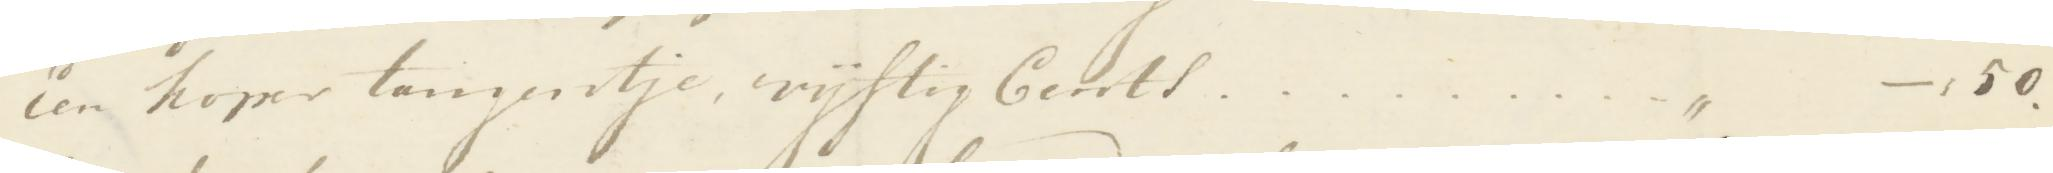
Een koper tangentje, vijftig Cents. . . . . . . . . . . . . . . . „ —:50.
